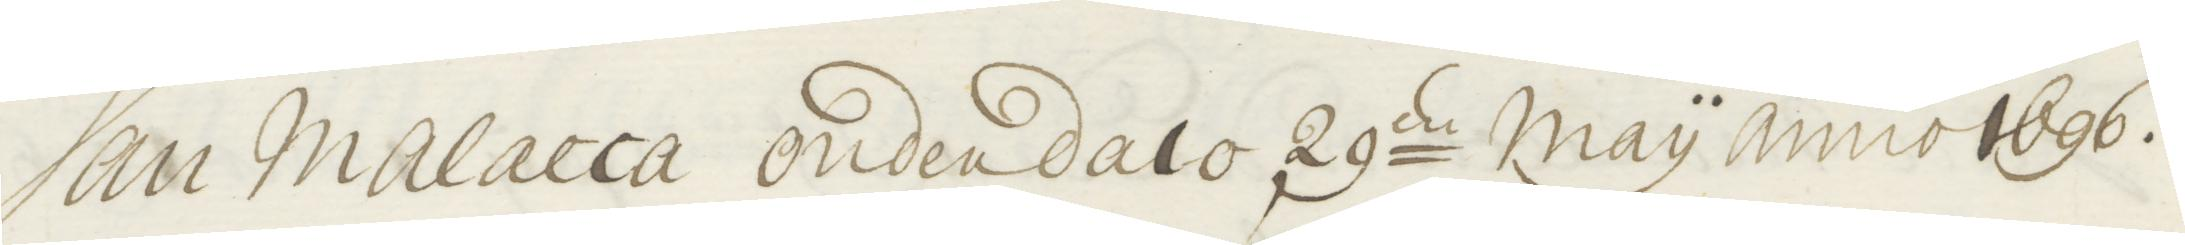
Van Malacca onder dato 29=en Maij anno 1696.
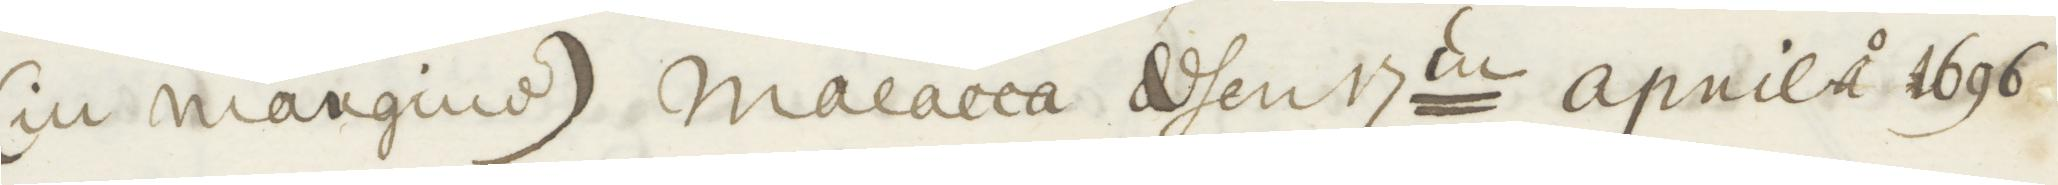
(in margine) malacca desen 17=en april Ao 1696
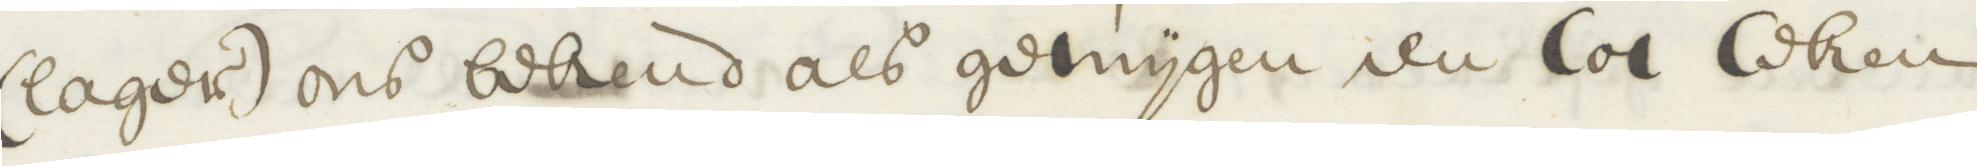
(lager) ons bekend als getuijgen en tot teken
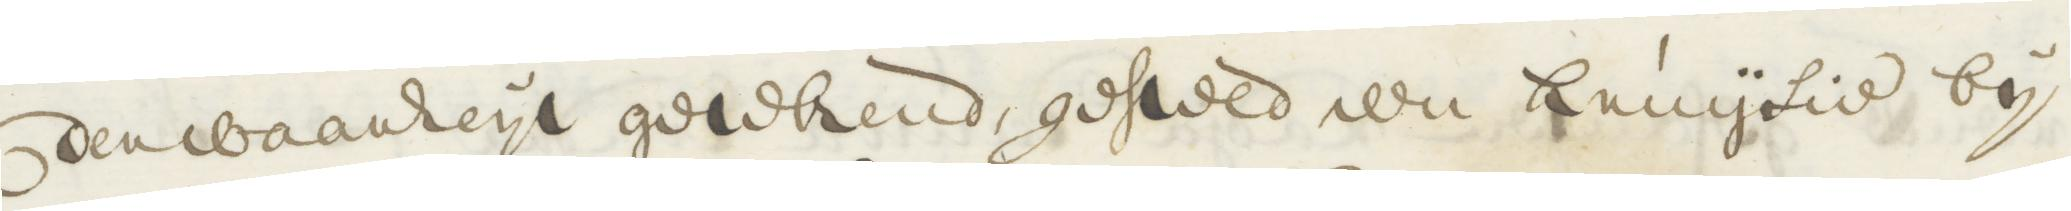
der waarheijt getekend, gesteld een kruijsie, bij
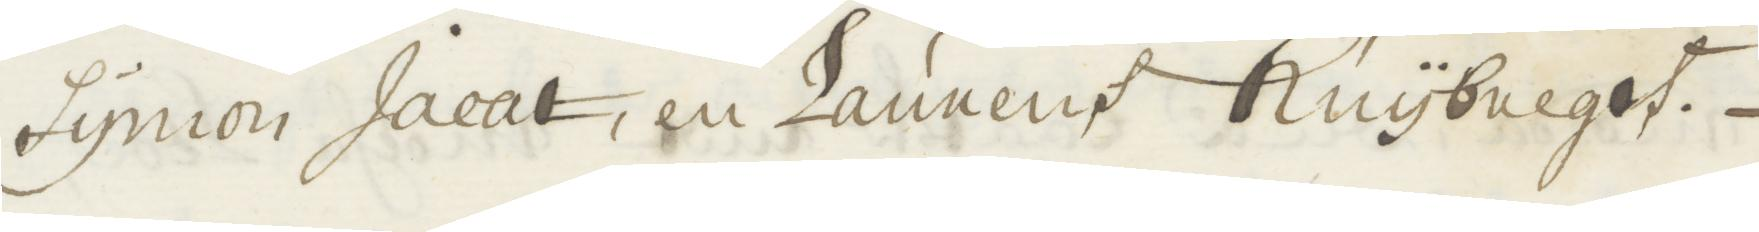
sijmon Jacat, en Laurens Huijbregts.
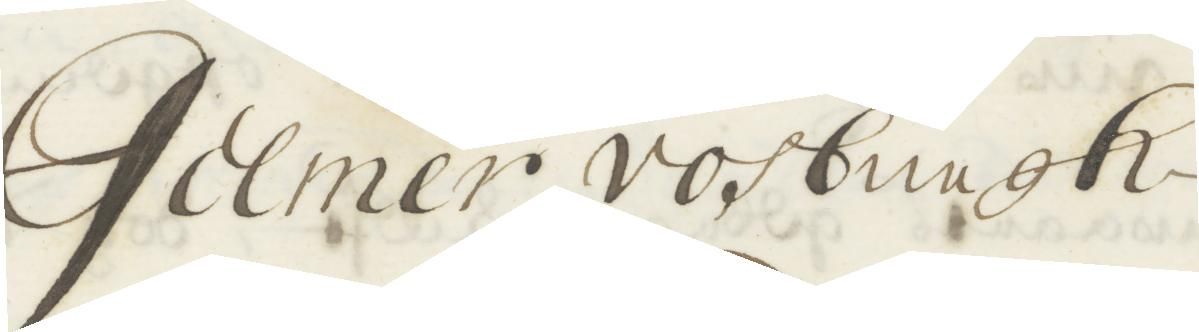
Gelmer vosburgh
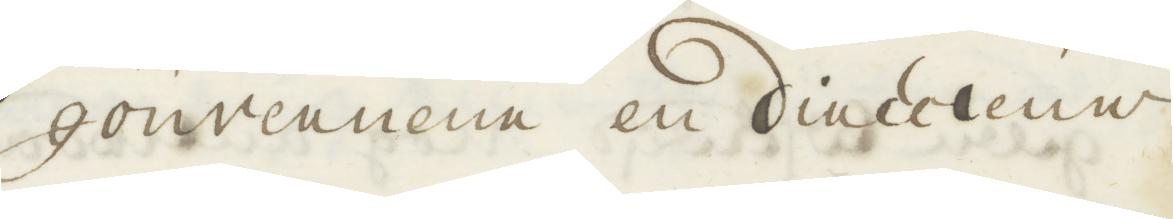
gouverneur en directeur
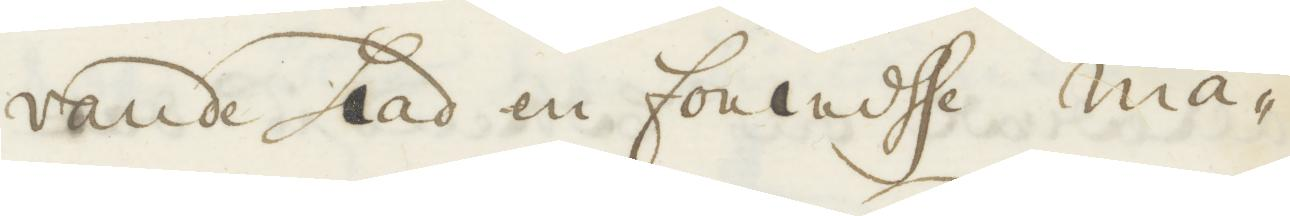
van de stad en fortresse ma„
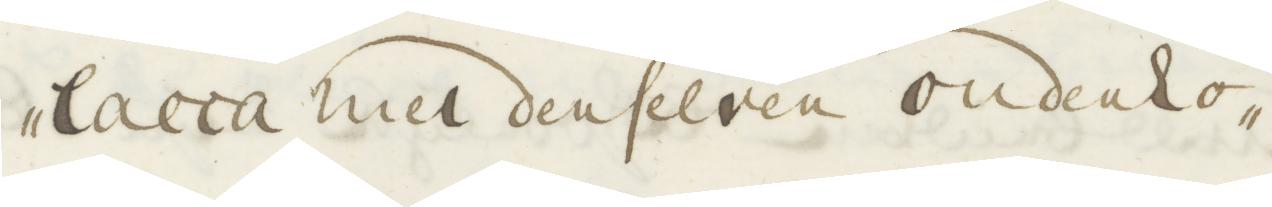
„lacca met derselver onderho„
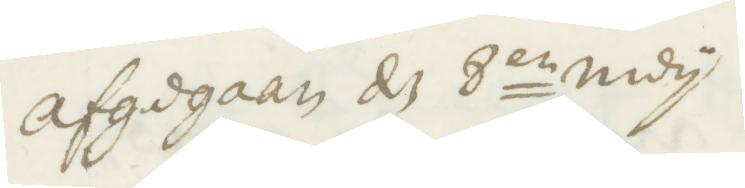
afgegaan den 8=en meij
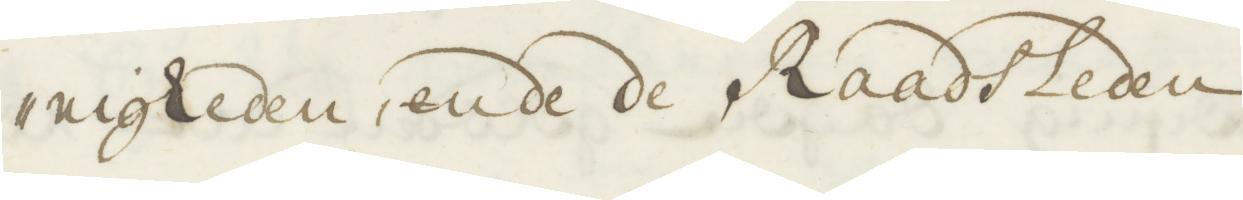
„righeden, ende de Raadsleden
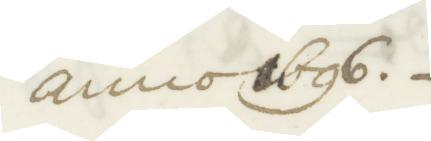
anno 1696.
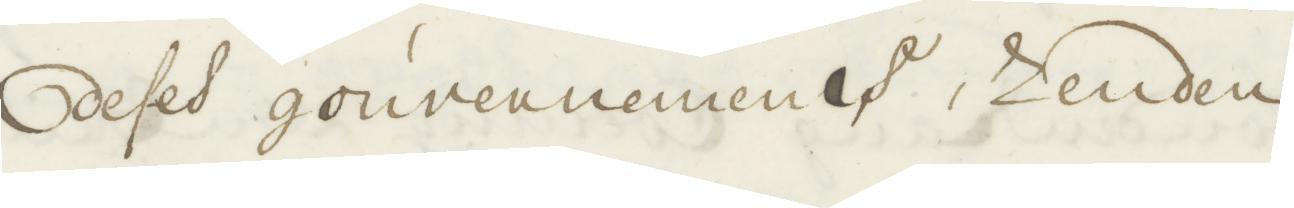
deses gouvernements, zenden
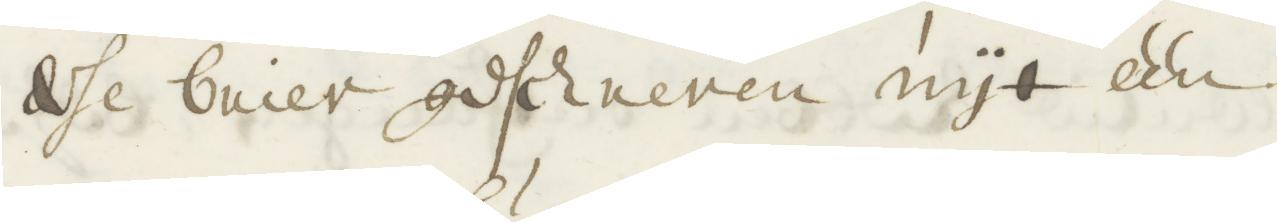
dese briev geschreven uijt een
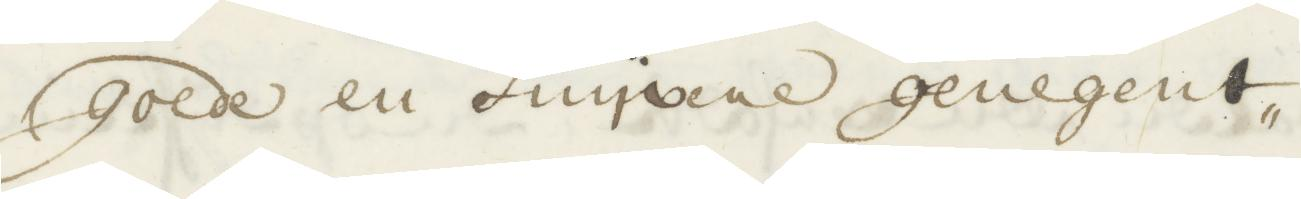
goede en suijvere genegent„
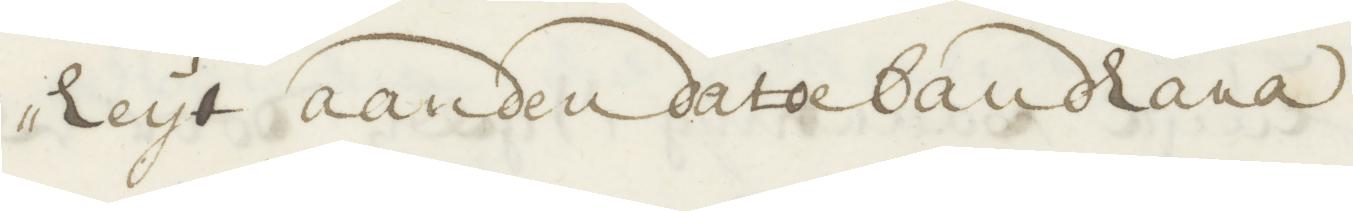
„heijt aan den datoe bandhara
